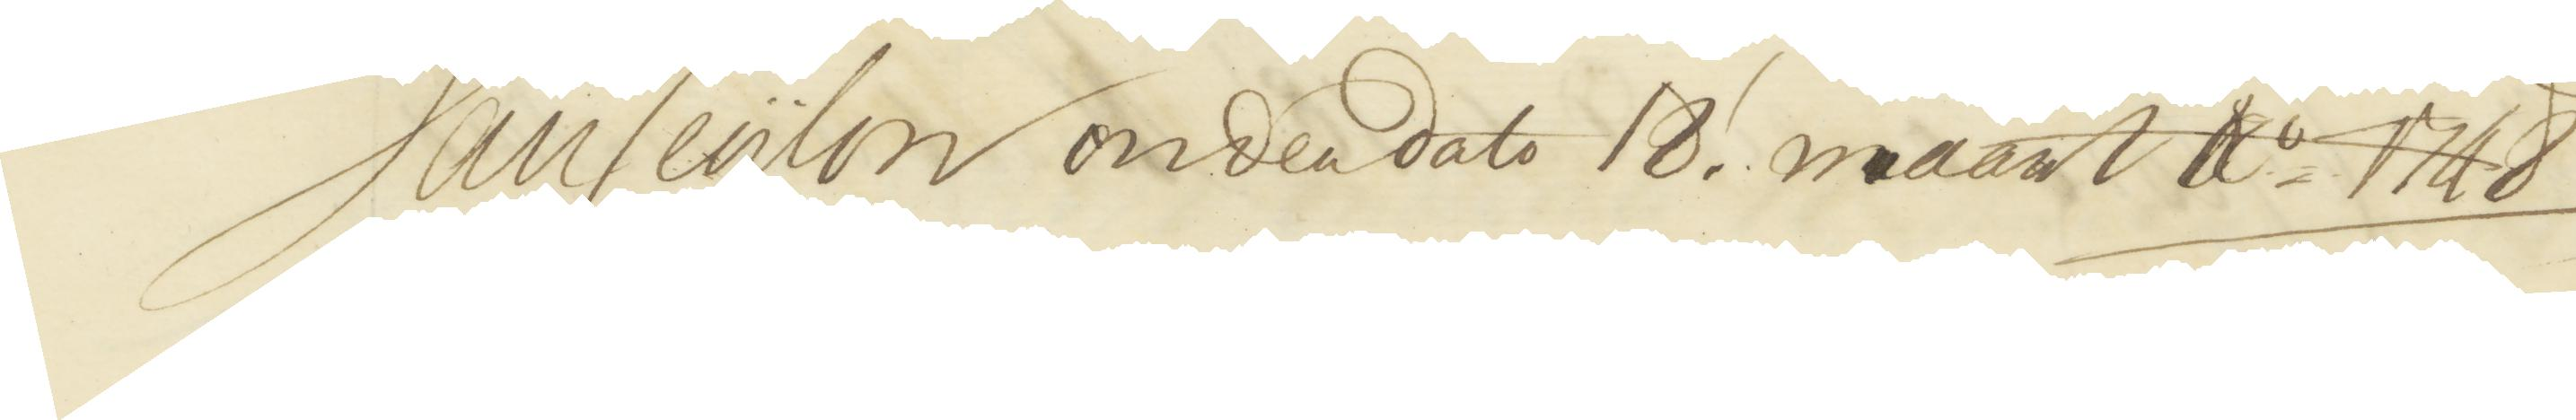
Van Ceijlon onder dato 18.' maart a=o 1748
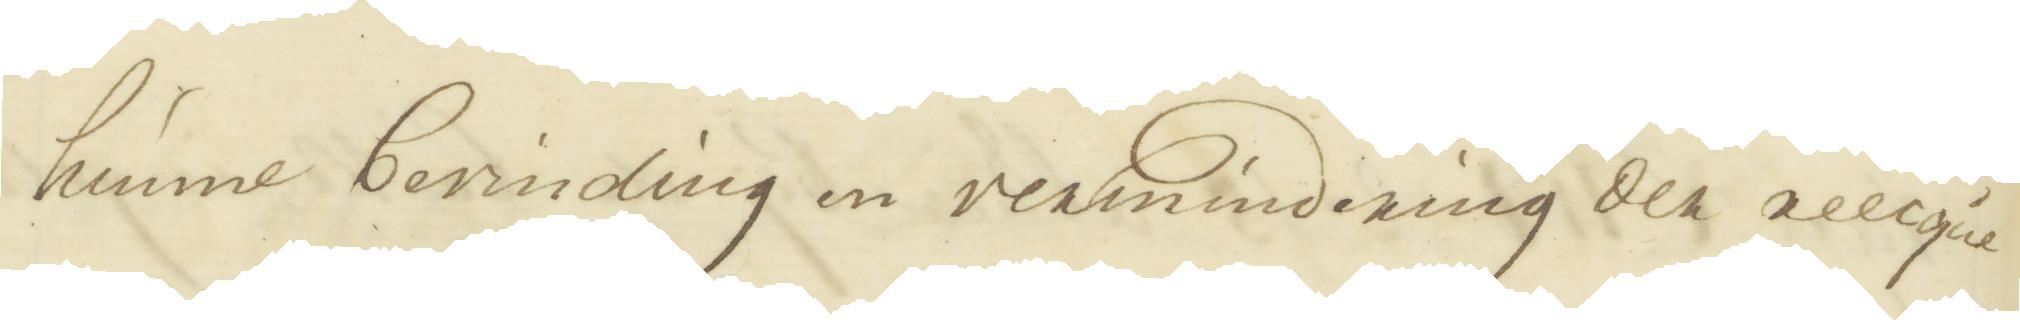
hunne bevinding en vermindering der reecque
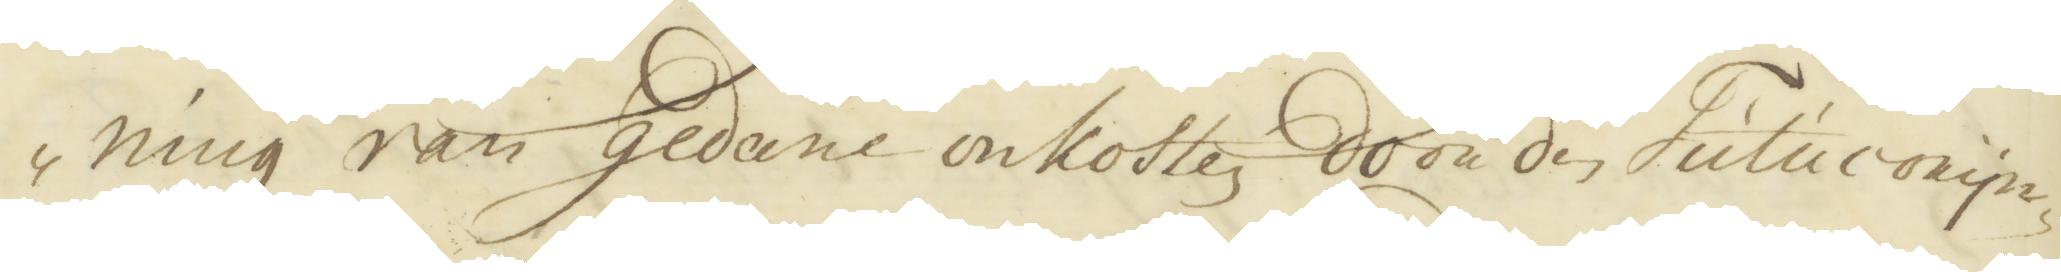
„ning van gedane onkosten door den Tutucorijn
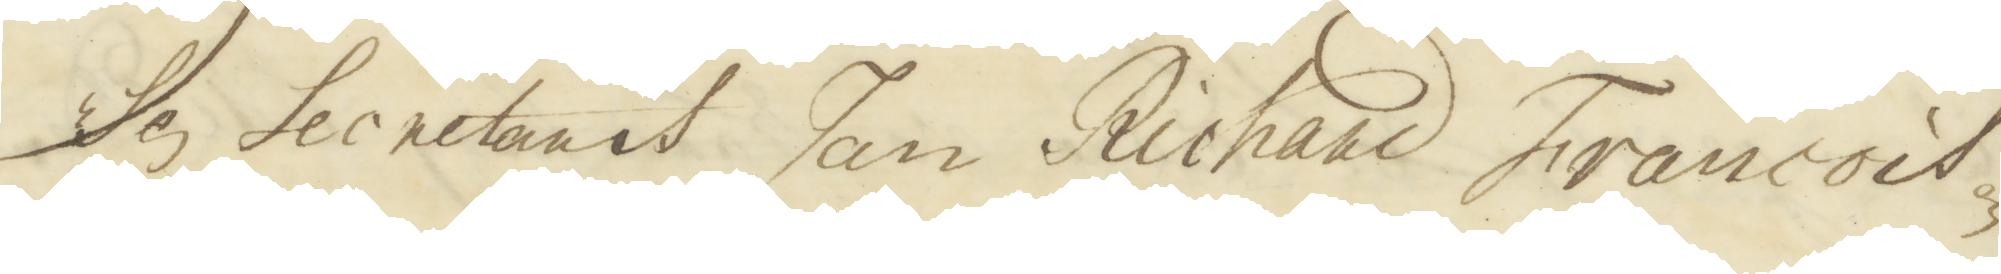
sen secretaris Jan Richard Francoisen
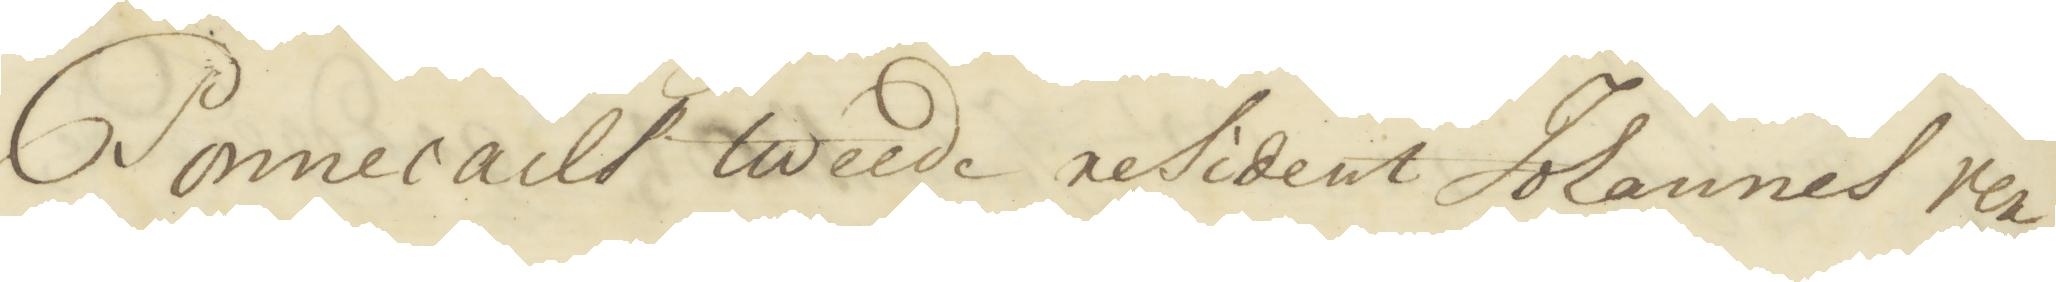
Ponnecails tweede resident Iohannes ver
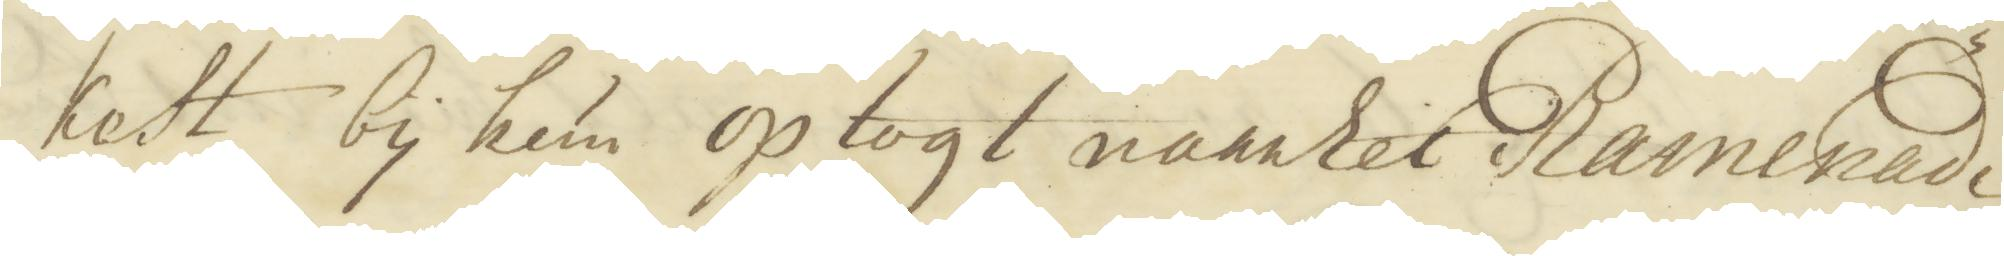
kest, bij hem op togt naar het Ramenade
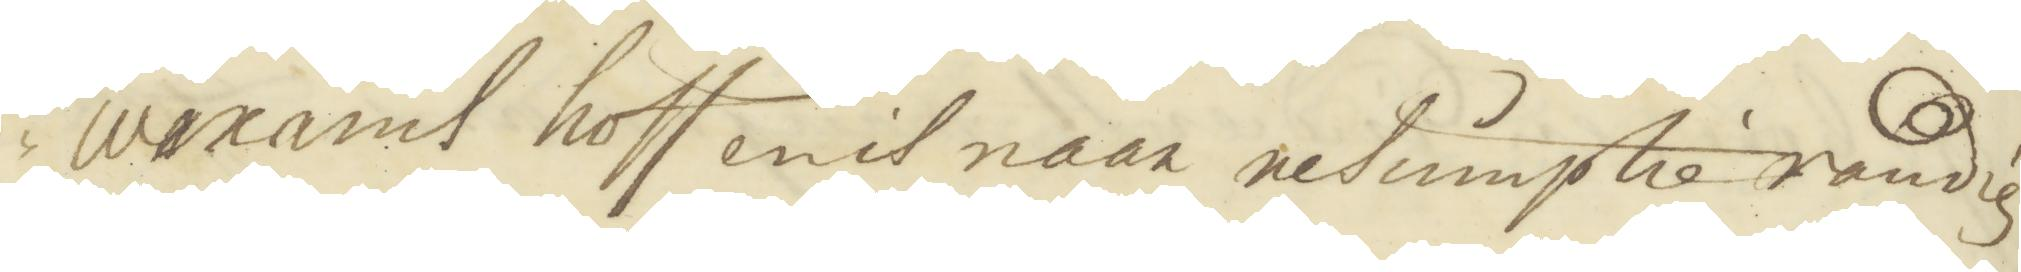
„warams hoff en is naar resumptie van dien
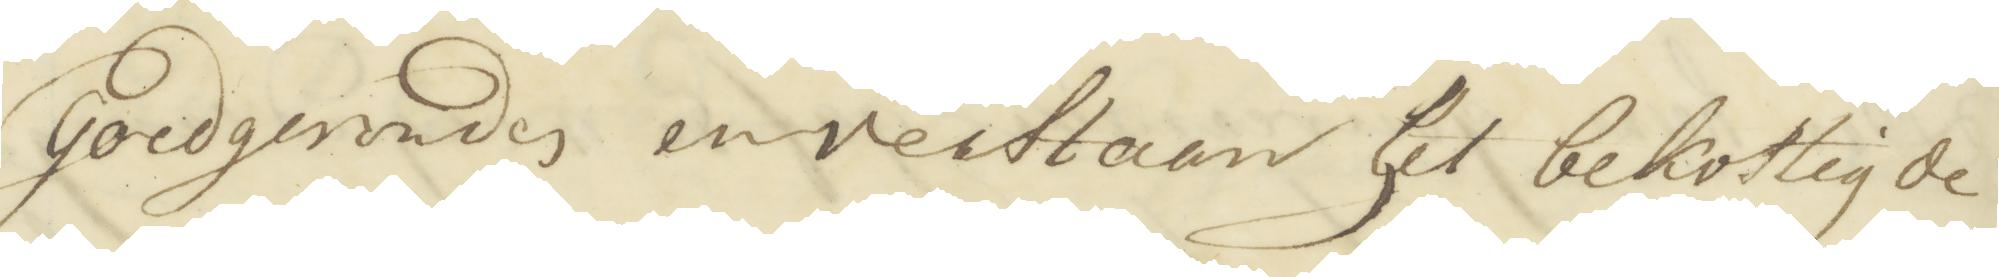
Goedgevonden en verstaan het bekostigde
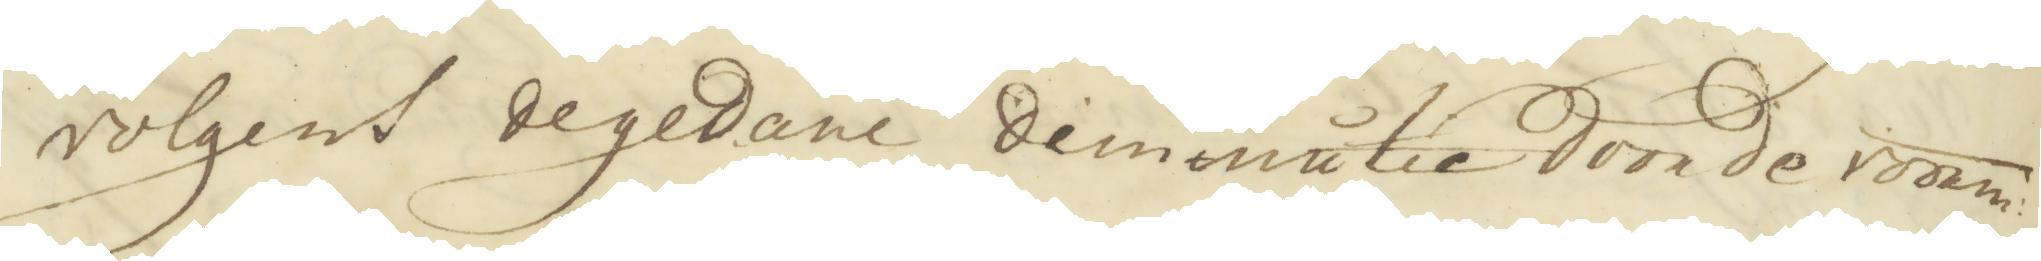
volgens de gedane deminutie door de voorm:
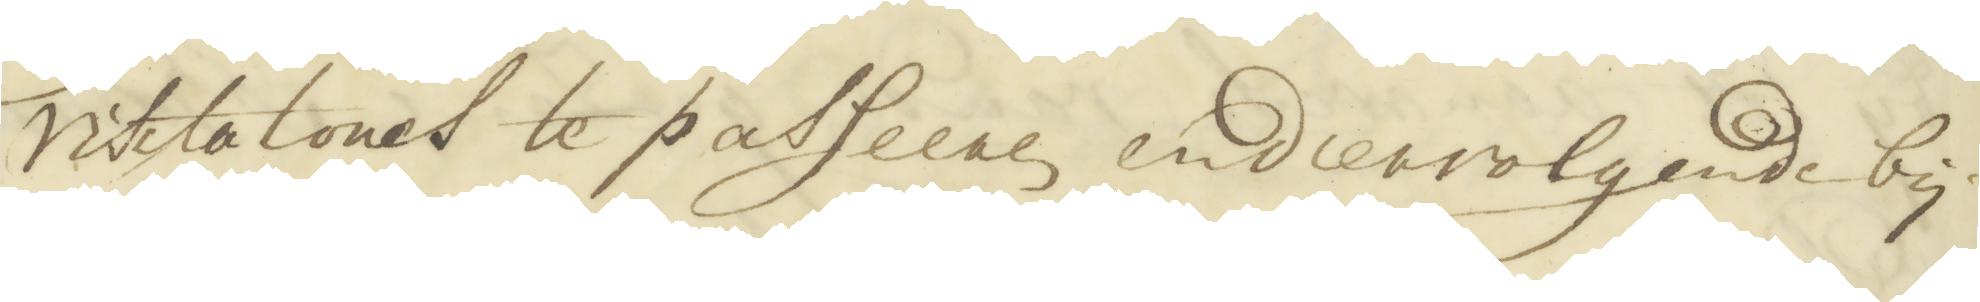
risetatones te passeeren en diervolgende bij
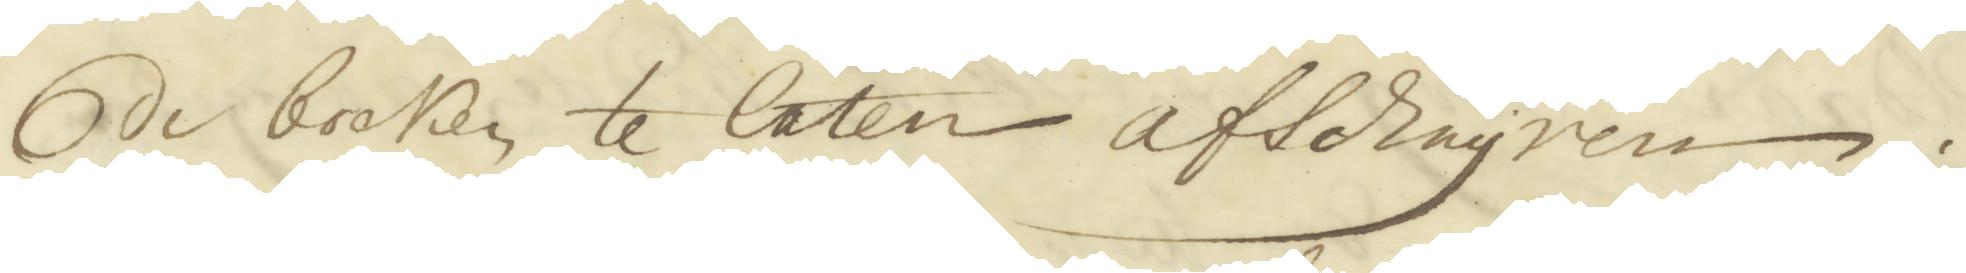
de boeken te laten afschrijven.
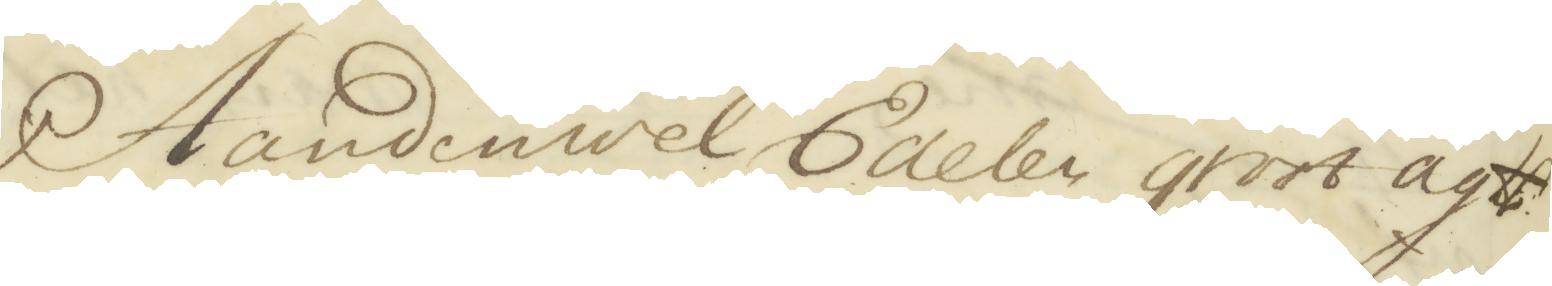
Aan den wel Edelen groot agtb:
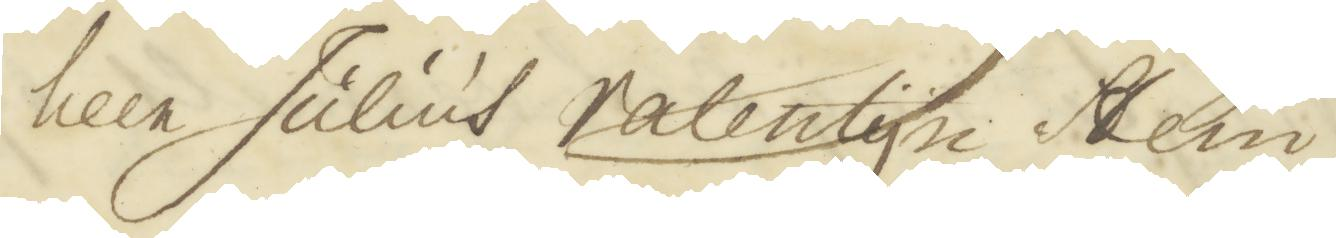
heer Julius valentijn Stein
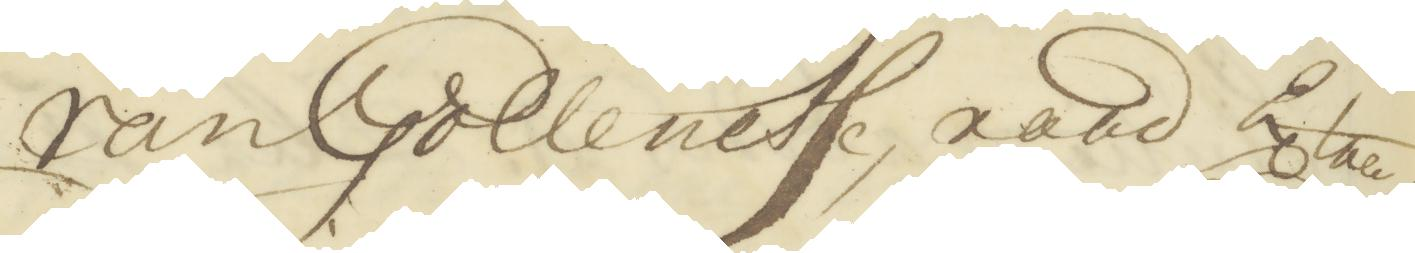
van Gollenesse, raad Extra
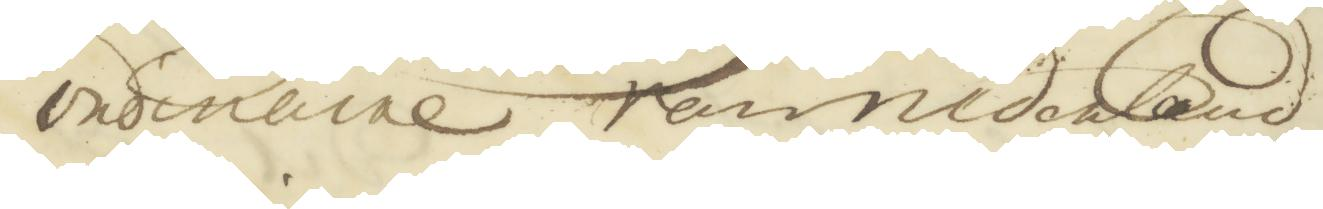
ordinaire van nederland
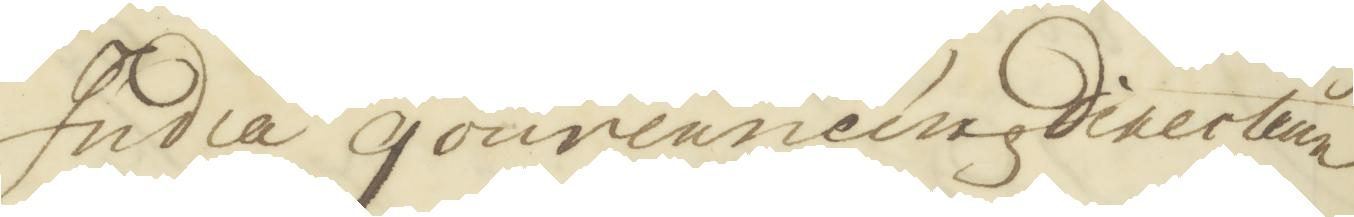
Jndia gouverneur directeur
